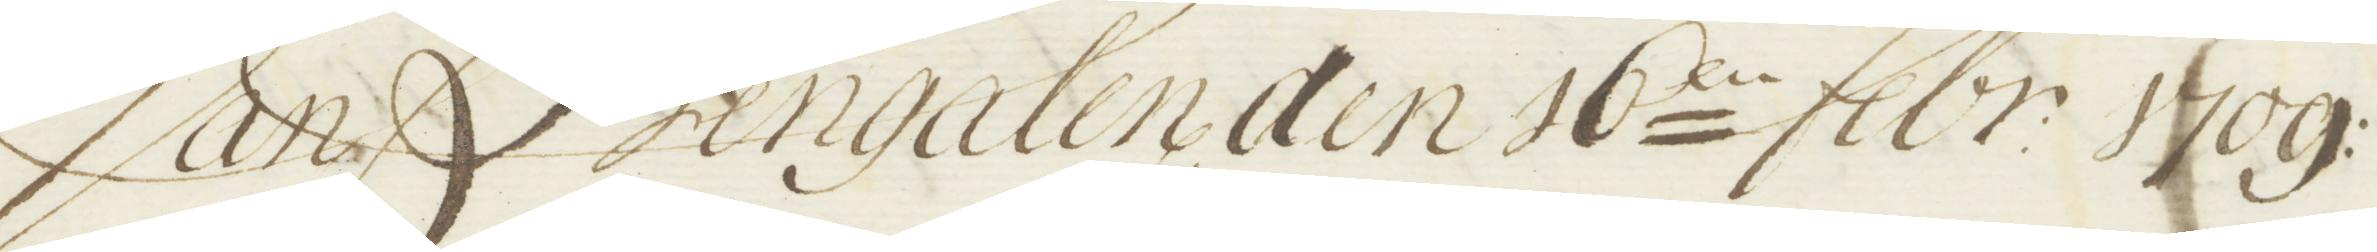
Van Bengalen, den 16=en febr: 1709:
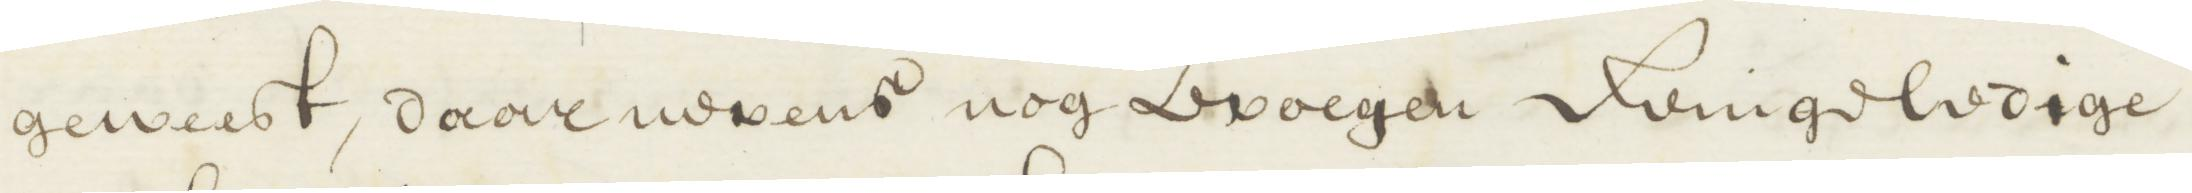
geweest, daar nevens nog tevoegen Eenige ledige
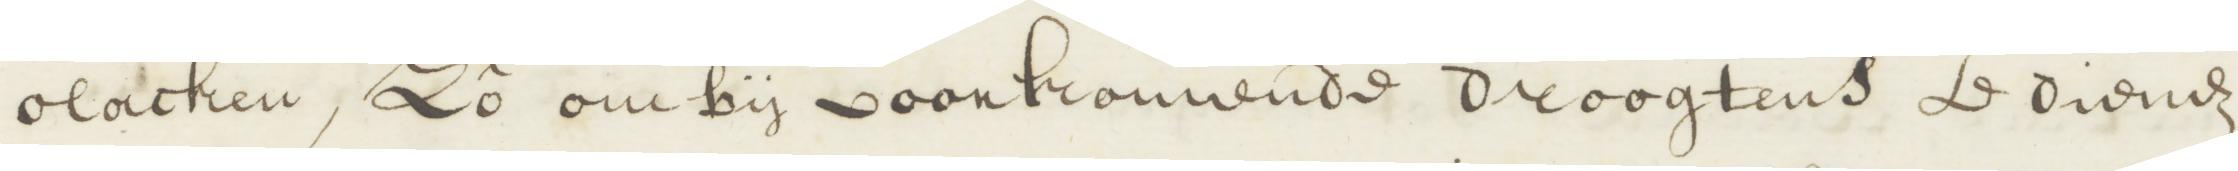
olacken, zo om bij voorkomende droogtens te dienen
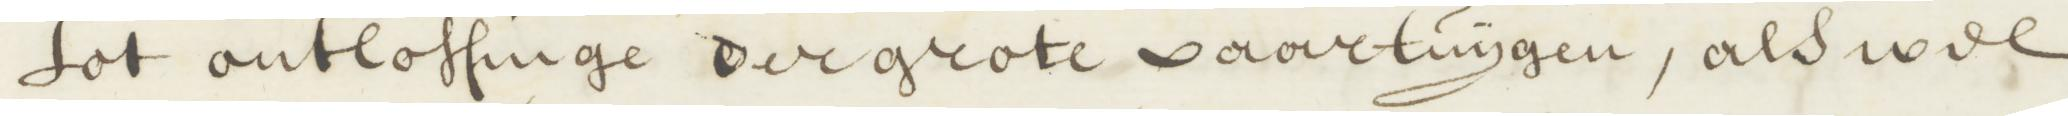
tot ontlossinge der grote vaartuijgen, als wel
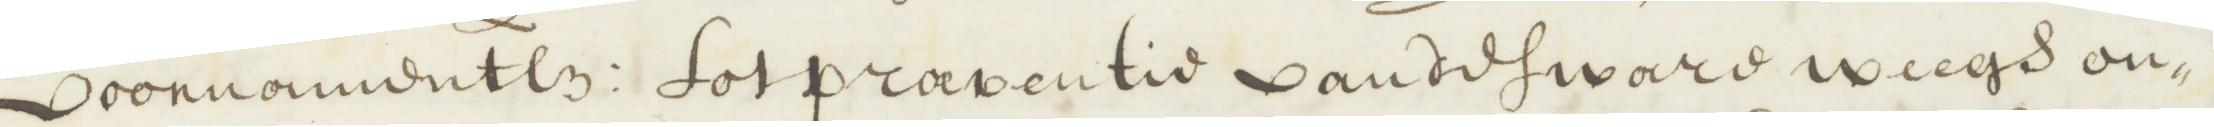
voornamentlijk: tot preventie van de sware weegs on„
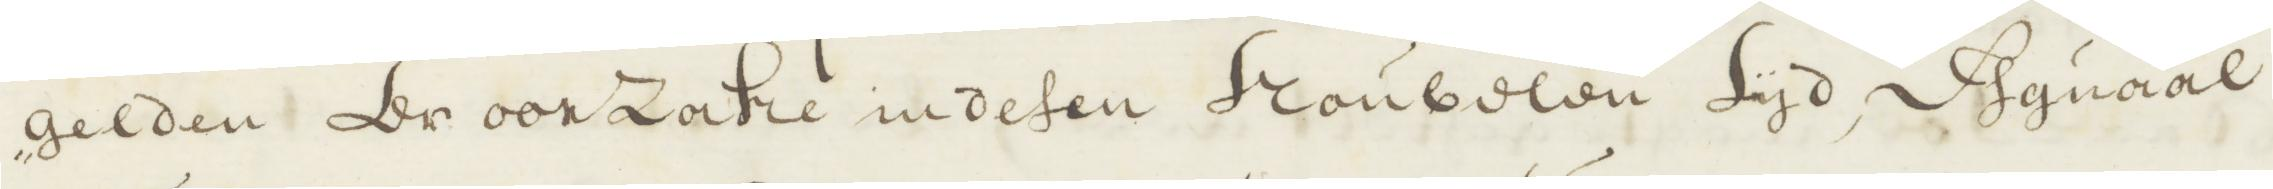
gelden ter oorzake in desen troubelen tijd, Eeguaal
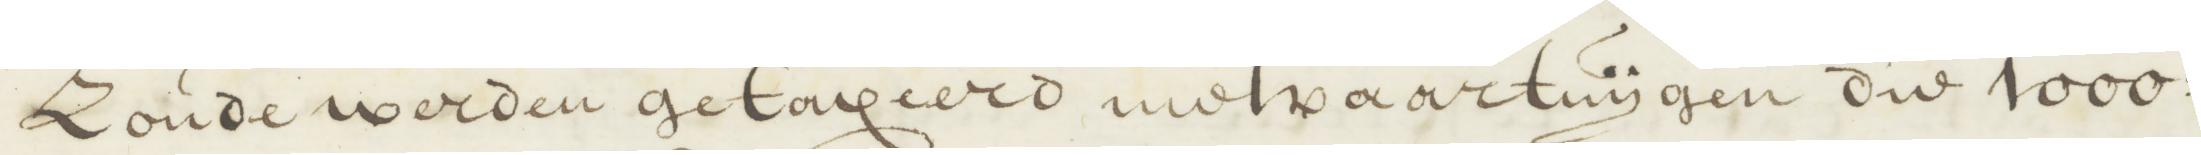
zoude werden getaxeerd met vaartuijgen die 1000:
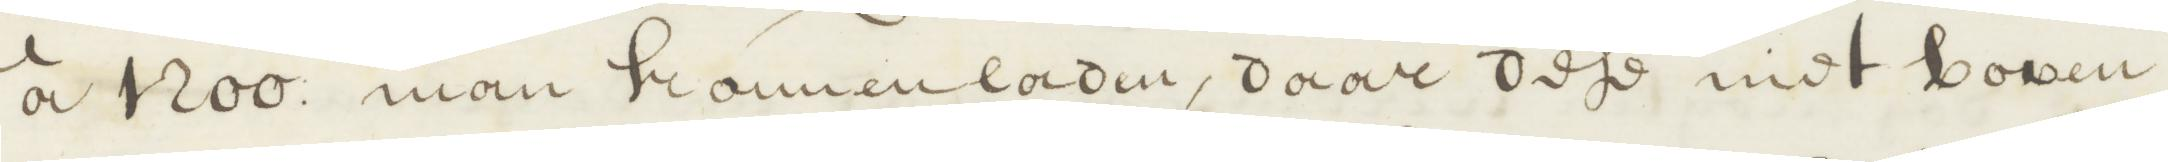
â 1200: man konnen laden, daar dese niet boven
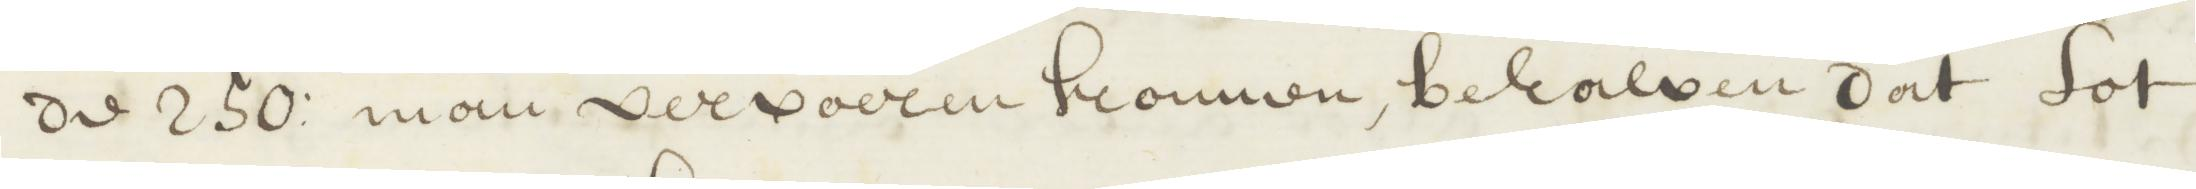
de 250: man vervoeren konnen, behalven dat tot
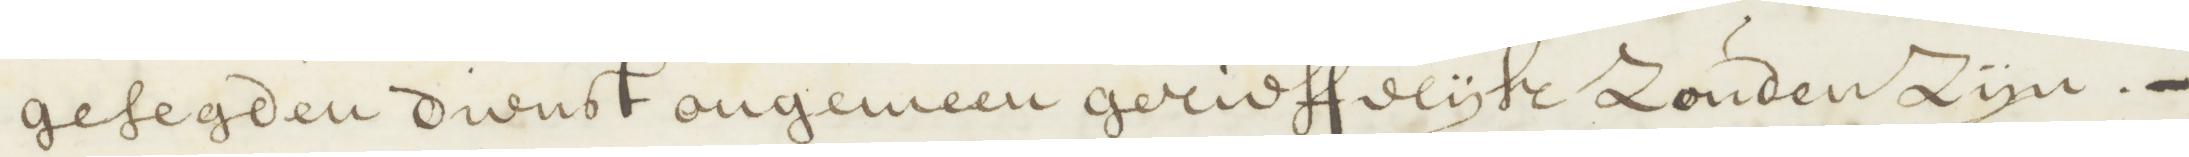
gesegden dienst ongemeen gerieffelijk zouden zijn.—
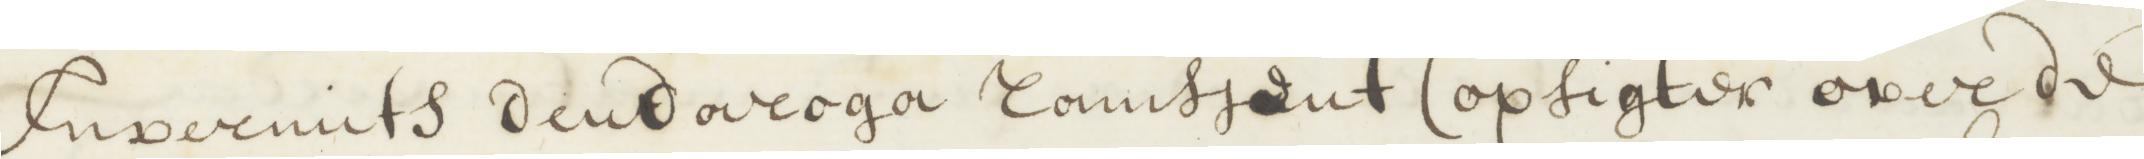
En vermits den daroga ramsjent (opsigter over de
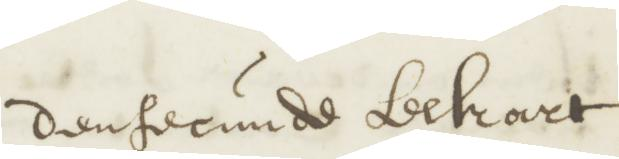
den secunde selkart
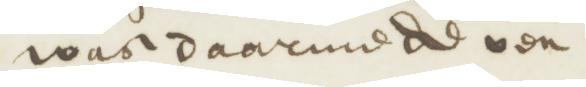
was daarmede ver
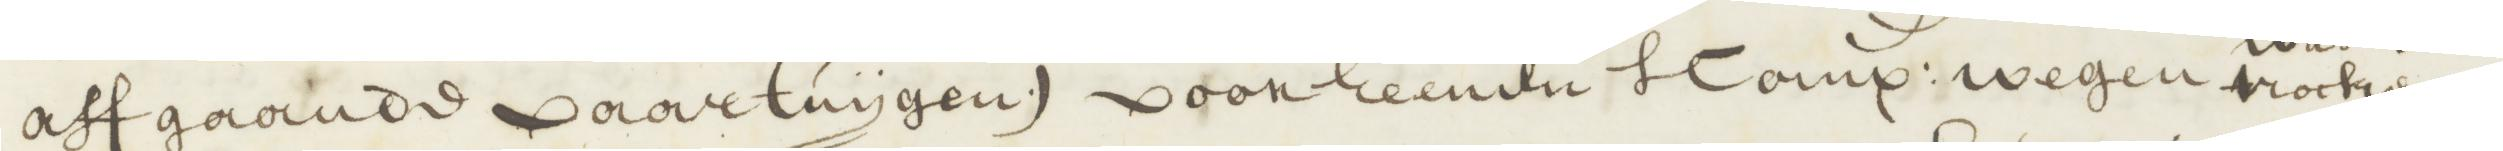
affgaande vaartuijgen:) voor heenen ’s Comp: wegen trocken
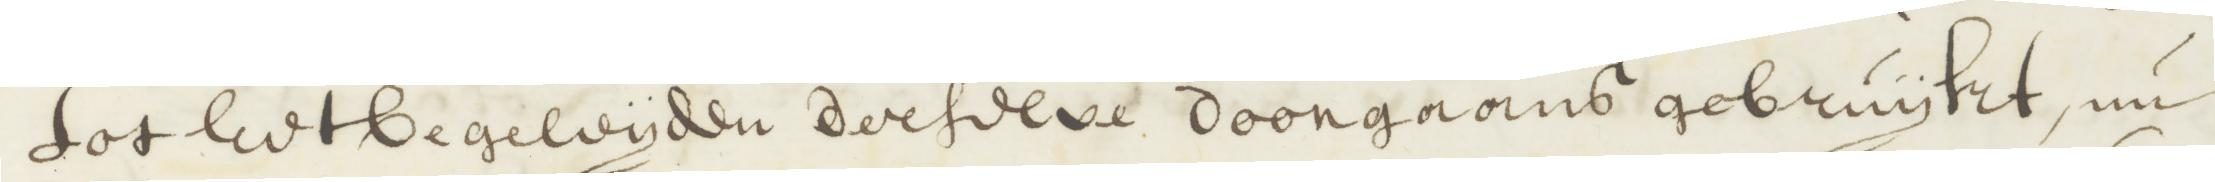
tot het begeleijden derselve doorgaans gebruijkt, nu
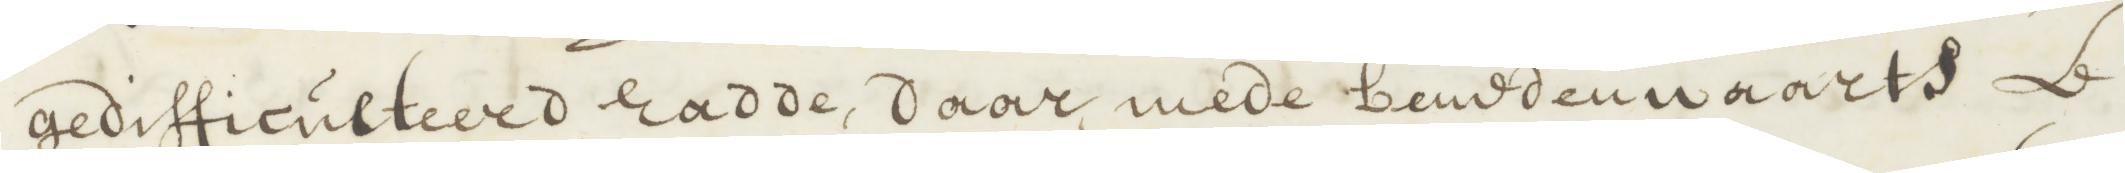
gedifficulteerd hadde, daar mede benedenwaarts te
